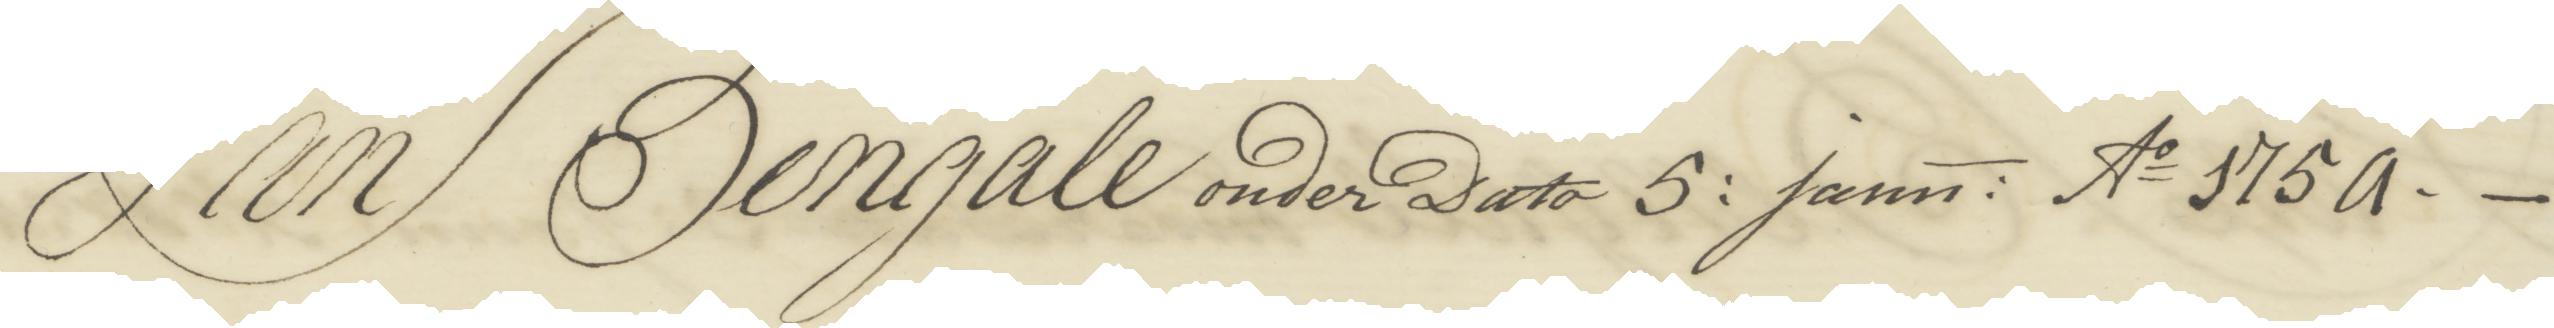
Van Bengale onder Dato 5: jann: A=o 1754. —
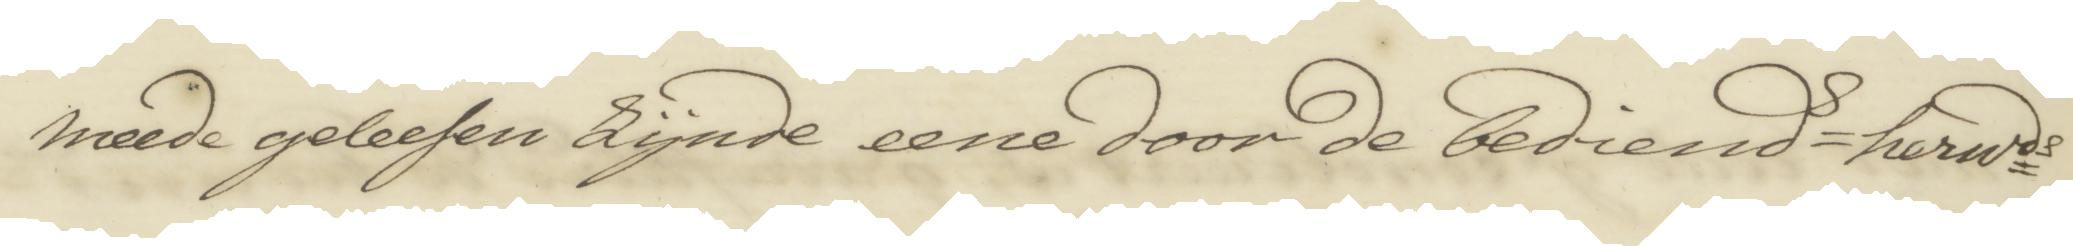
meede geleesen Zijnde eene door de bediend=s herw=ds
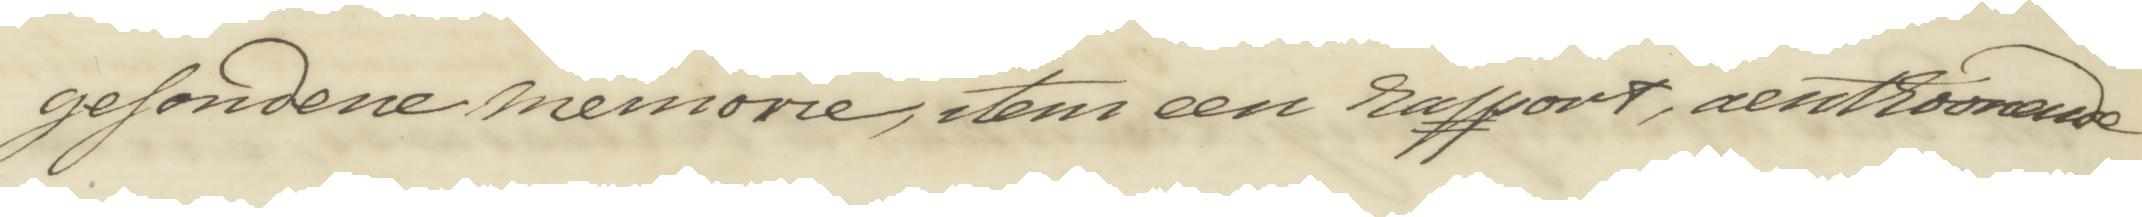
gesondene memorie, item een rapport, aenthoonende
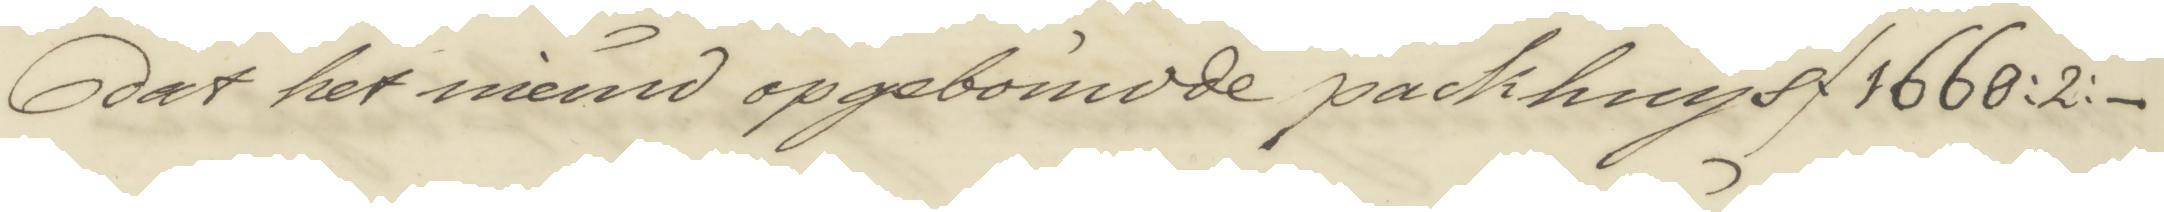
dat het nieuw op gebouwde packhuijs ƒ 1668:2:—
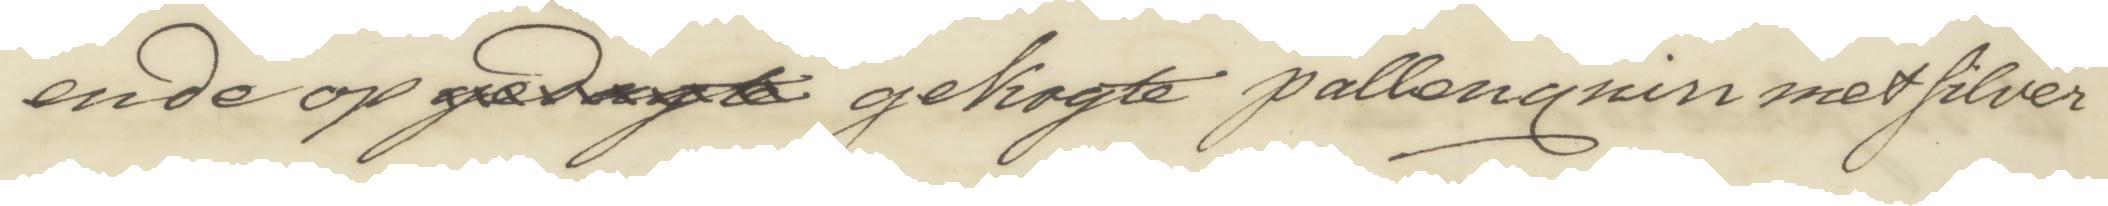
ende op gedagte gekogte pallenquin met Silver
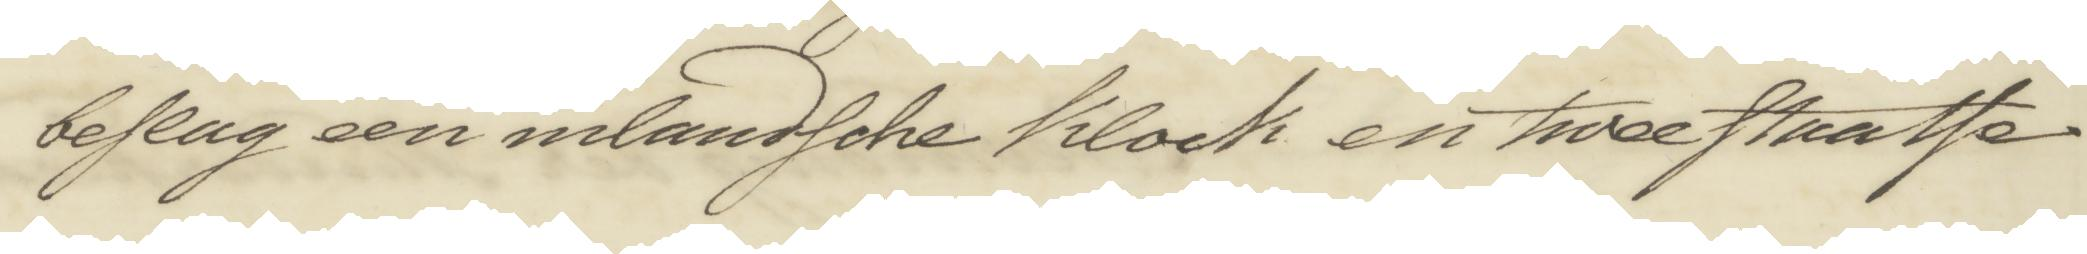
beslag een inlandsche klock en twee staatse
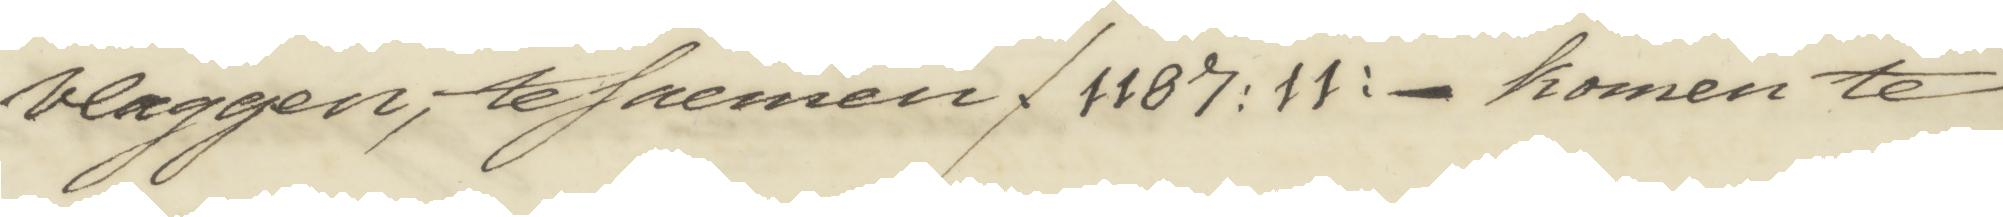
vlaggen, te saemen ƒ1187:11:— komen te
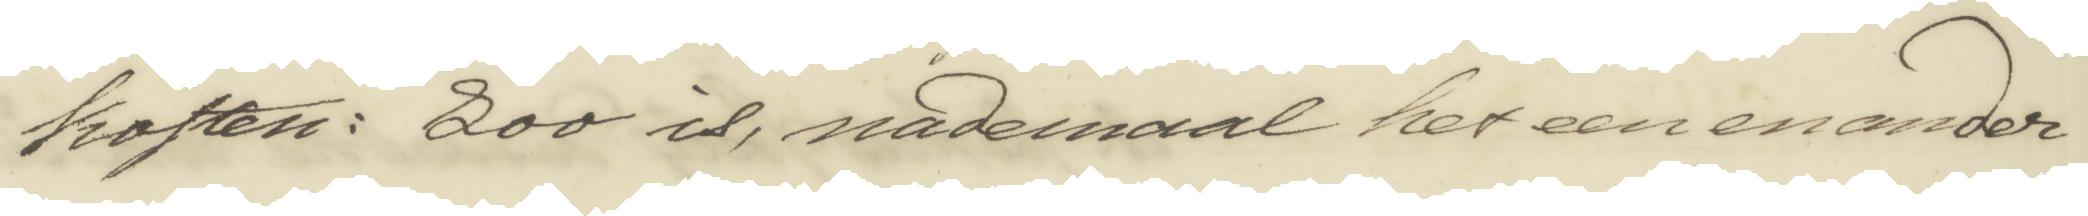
kosten: Zoo is, nademaal het een en ander
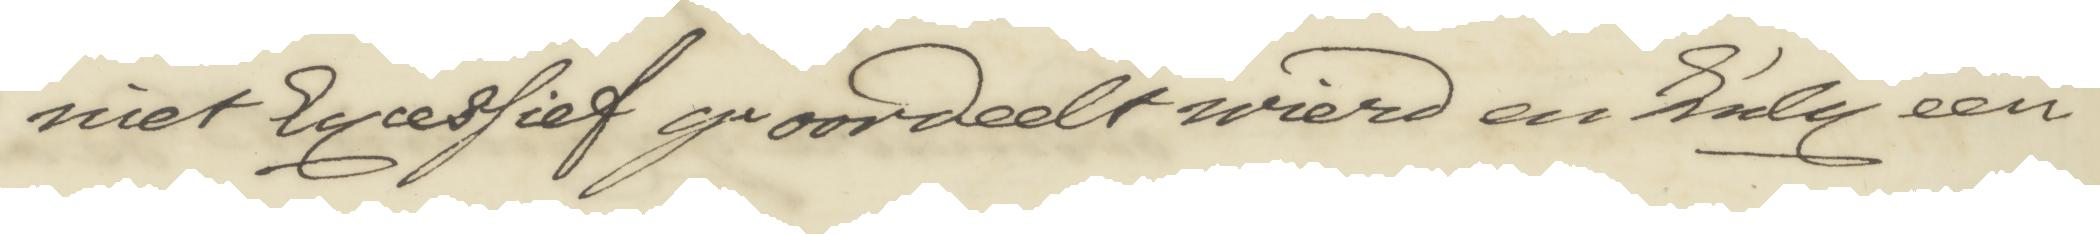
niet Excessief g'oordeelt wierd en Zulx een
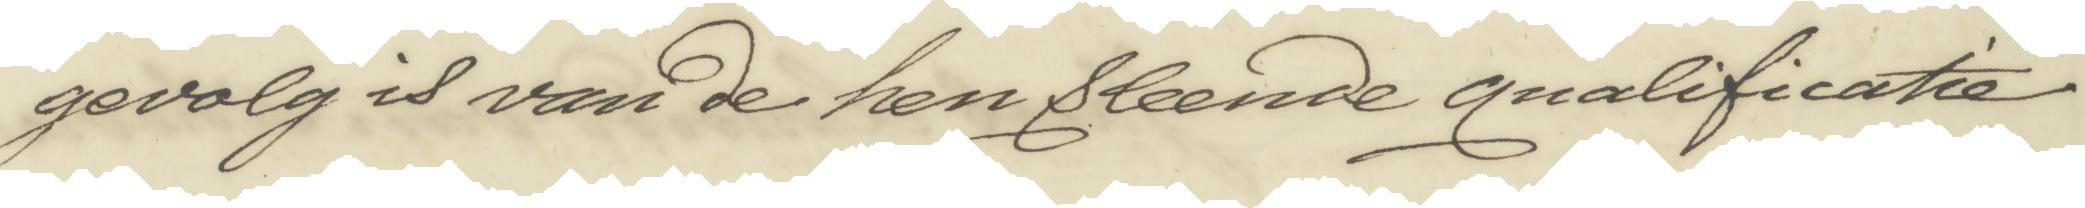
gevolg is van de hen verleende qualificatie
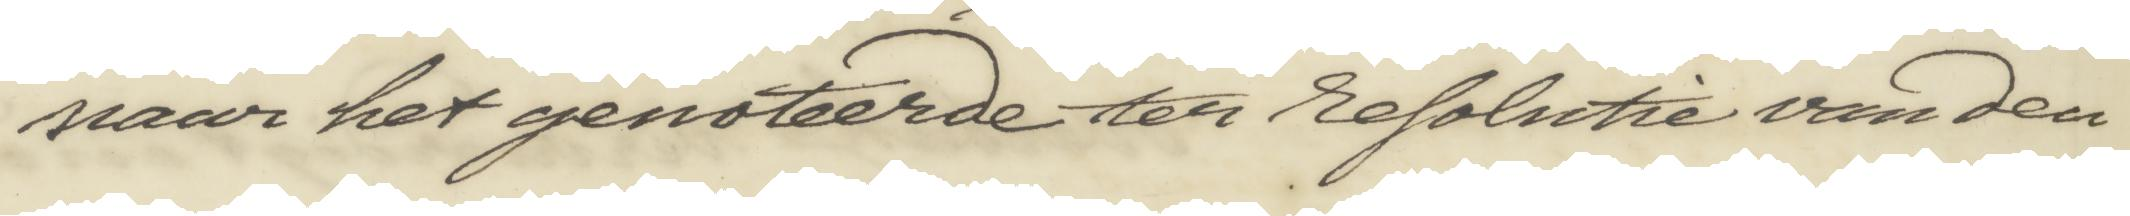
naar het genoteerde ter resolutie van den
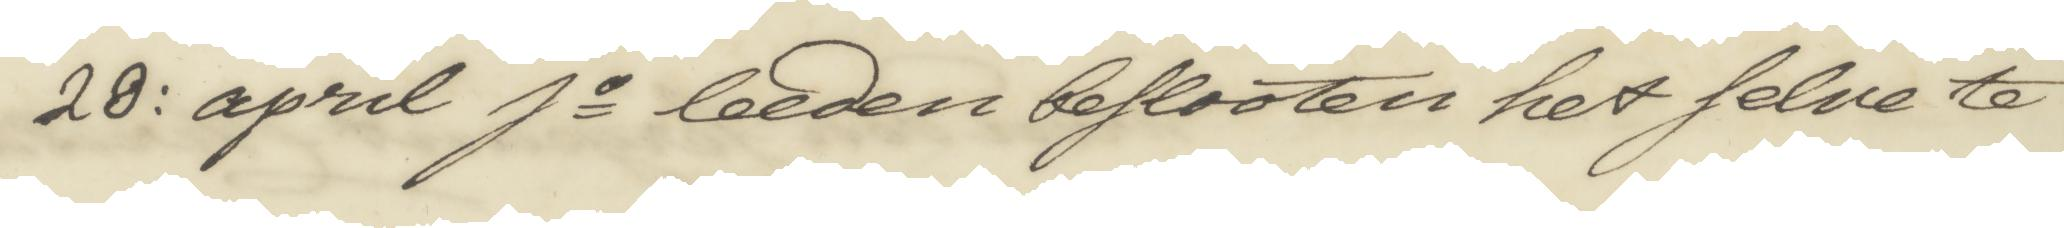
28: april j=o leeden beslooten het Selve te
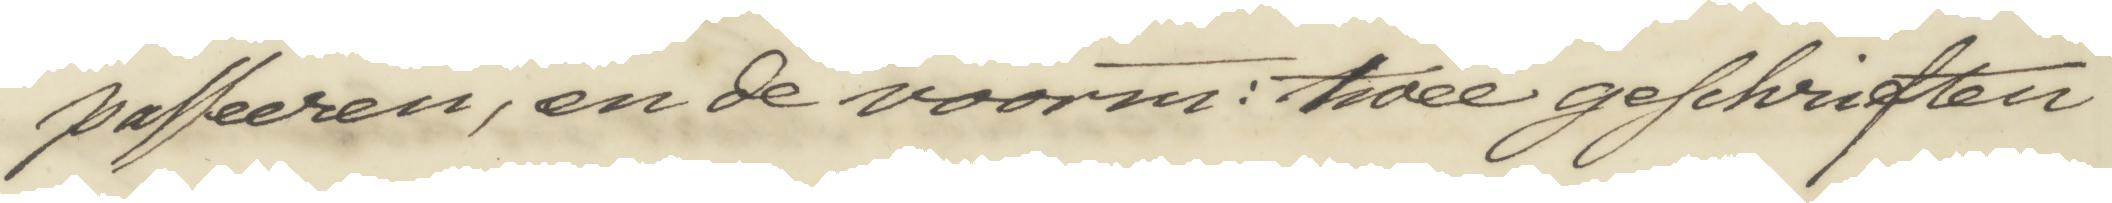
passeeren, en de voorm: twee geschriften
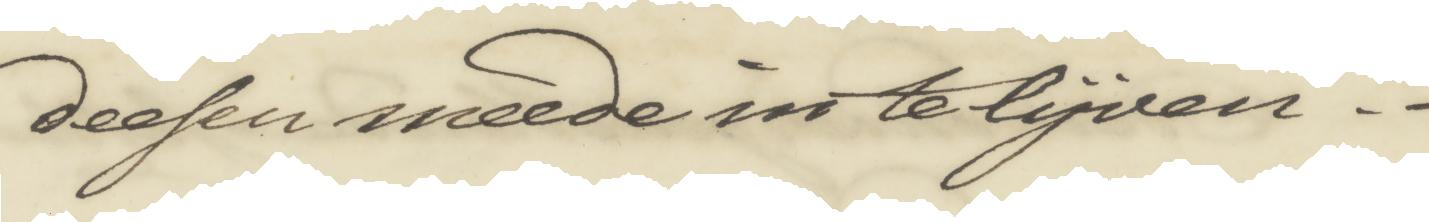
deesen meede in te lijven._
